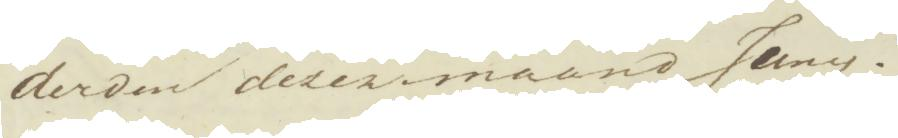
derden dezer maand Juny.
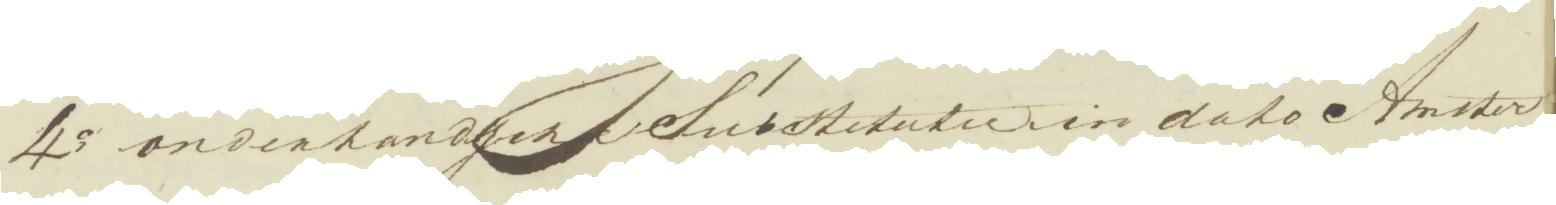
4:o onderhandsche Substitutie in dato Amster=
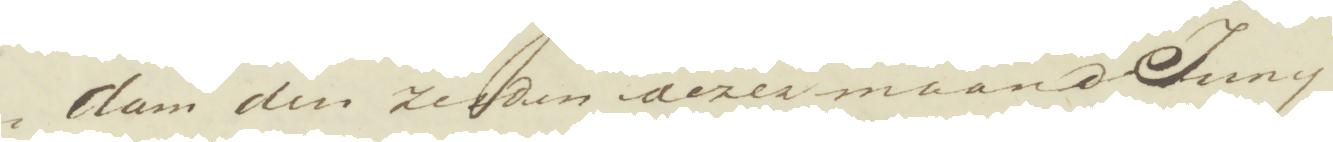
=dam den zesden dezer maand Juny
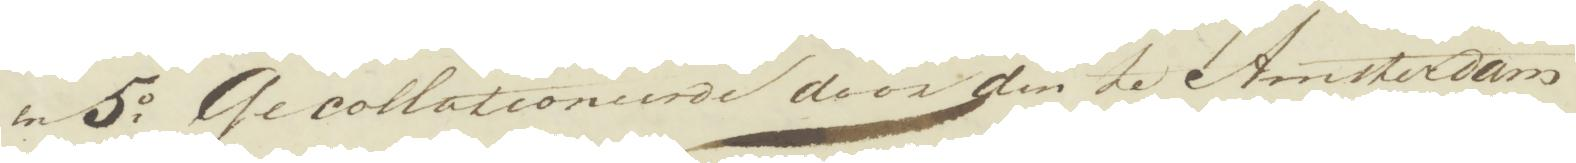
en 5:o Gecollationeerde door den te Amsterdam
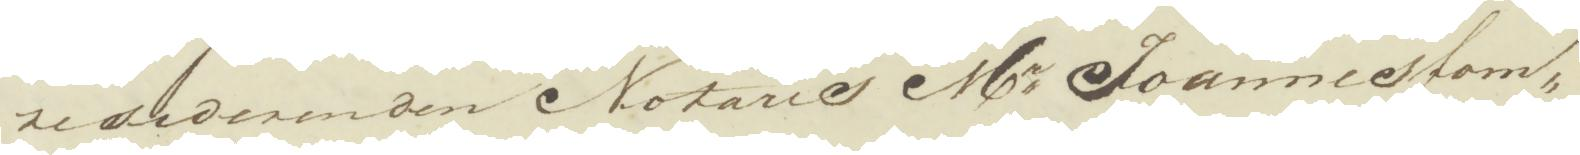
residerenden Notaris M„r Joannes Com„
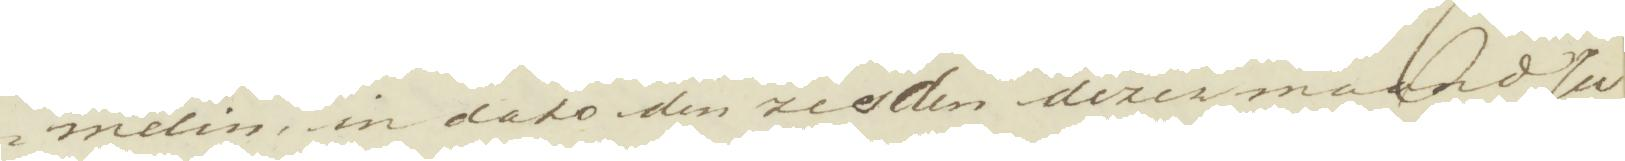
melin, in dato den zesten dezer maand Ju=
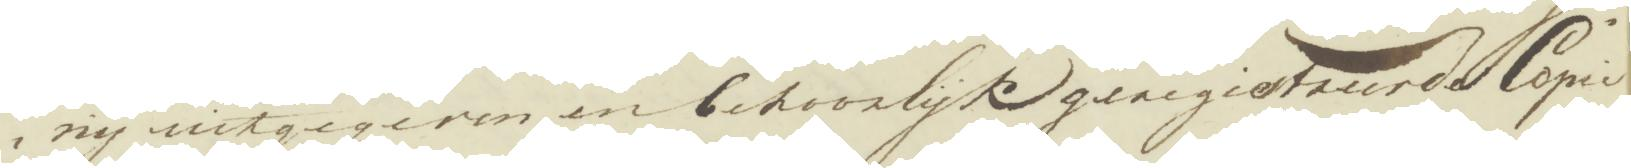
=nij uitgegeven en behoorlijk geregistreerd Copie
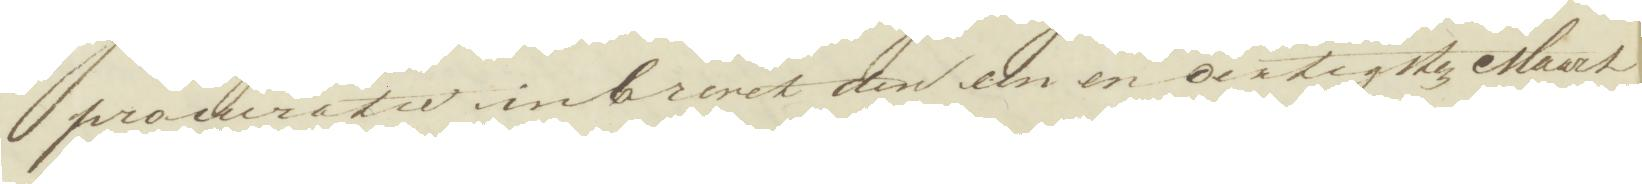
procuratie in brevet den een en dertigsten Maart
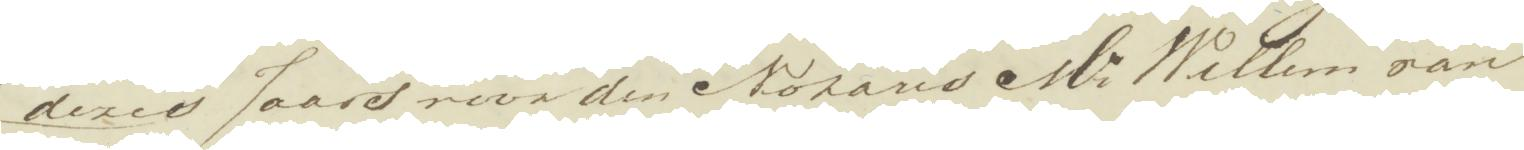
dezes Jaars voor den Notaris M„r Willem van
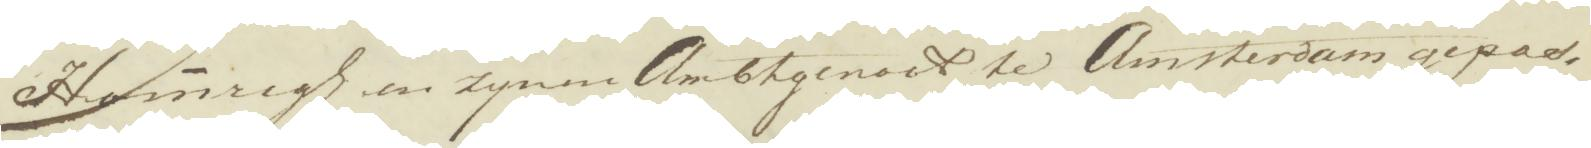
Homrigh en zynen Ambtgenoot te Amsterdam gepas-
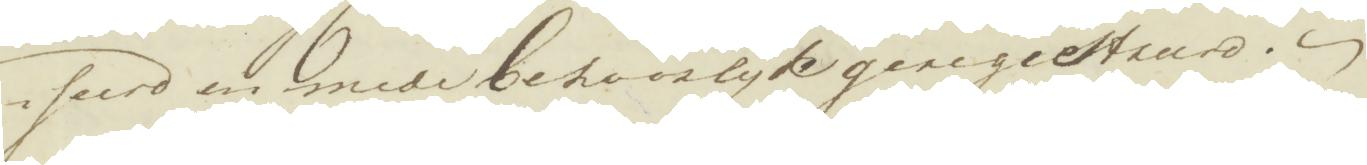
=seerd en mede behoorlyk geregistreerd.
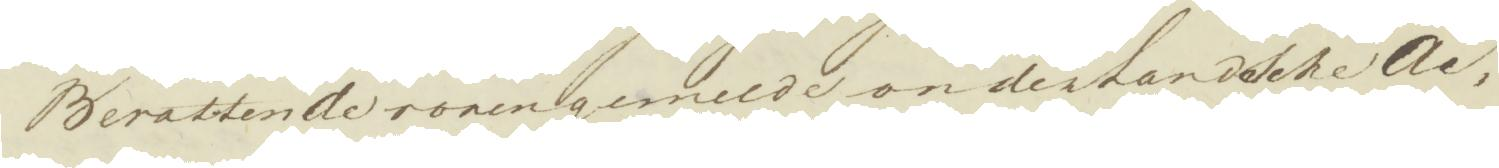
Bevattende vorengemelde onderhandsche Ac=
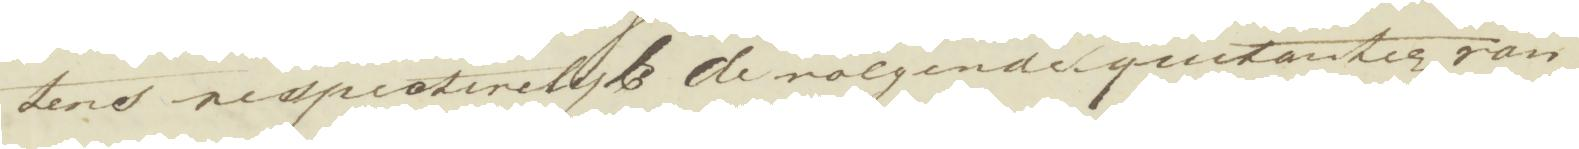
tens respectivelyk de volgende quitantien van
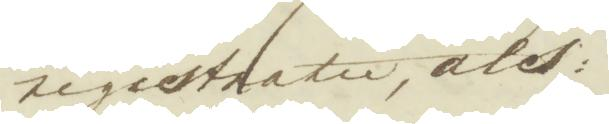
registratie, als:
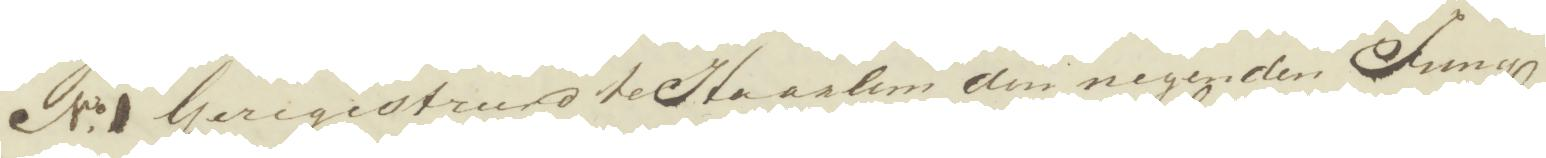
N.o 1 Geregistreerd te Haarlem den negenden Juny
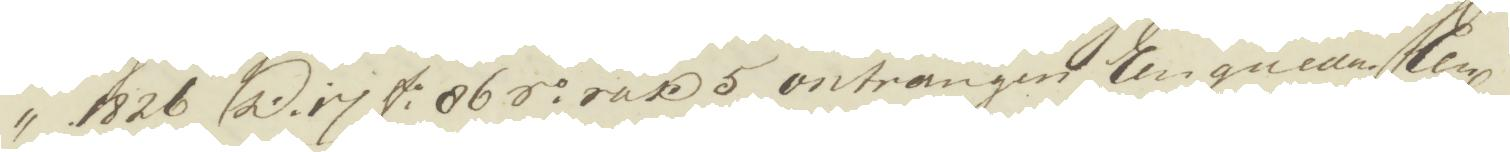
„ .1826 D. 17 f:o 86 v„o vak 5 ontvangen Een gulden Een
